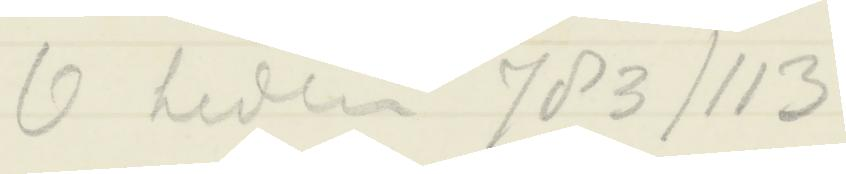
heden 783 /113
